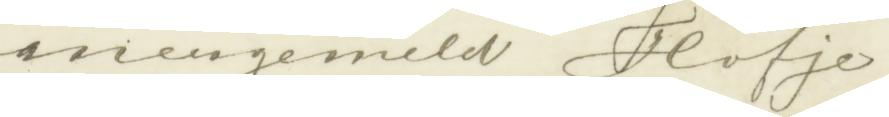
vorengemeld Hofje
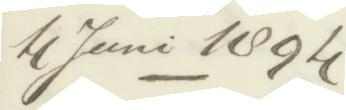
4 Juni 1894
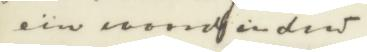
één woord in den
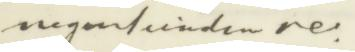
negentienden re:
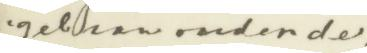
gel van onder de
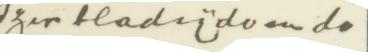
zer bladzijde en de
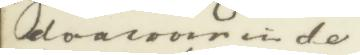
daarvoor in de
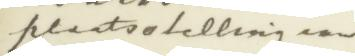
plaatsstelling van
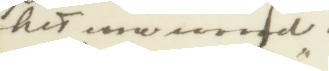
het eene woord
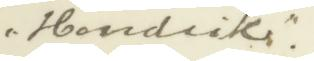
„Hendrik".
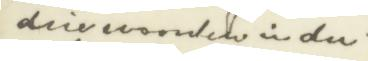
drie woorden in den
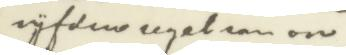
vijfden regel van on
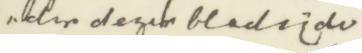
der op dezer bladzijde
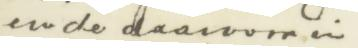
en de daarvoor in
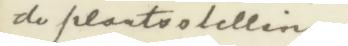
de plaatsstelling
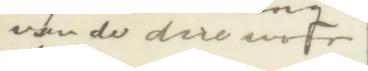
van de drie woor
